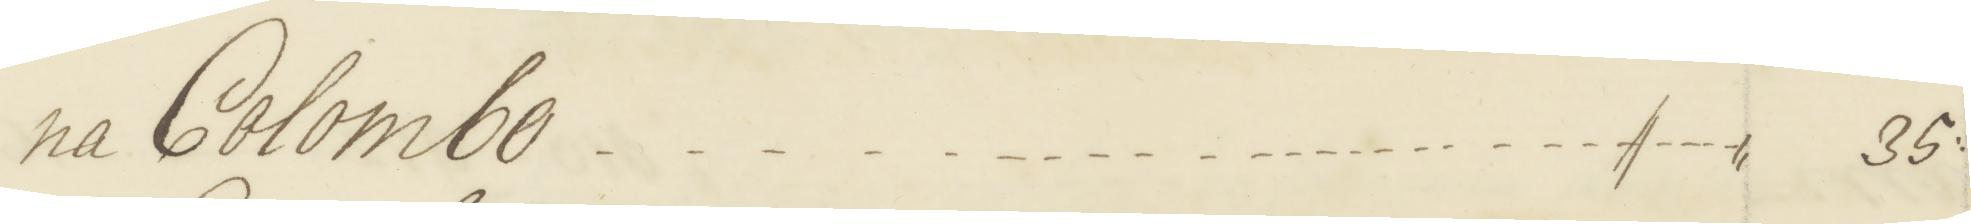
na Colombo - - - - - - - - - - - - - - - - - - - -„----„ 35:
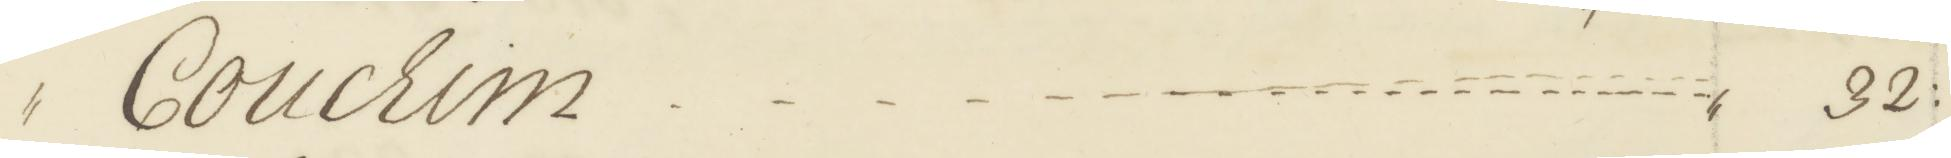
„ Couchim . - - - - - -- - - - - - - -- - - - - -„ 32:
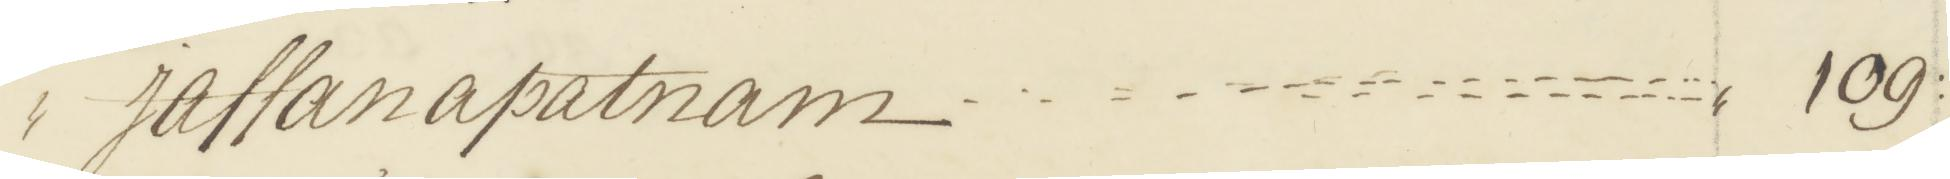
„ Jaffanapatnam - - = - = = - = - = = = = = = = .-„ 109:
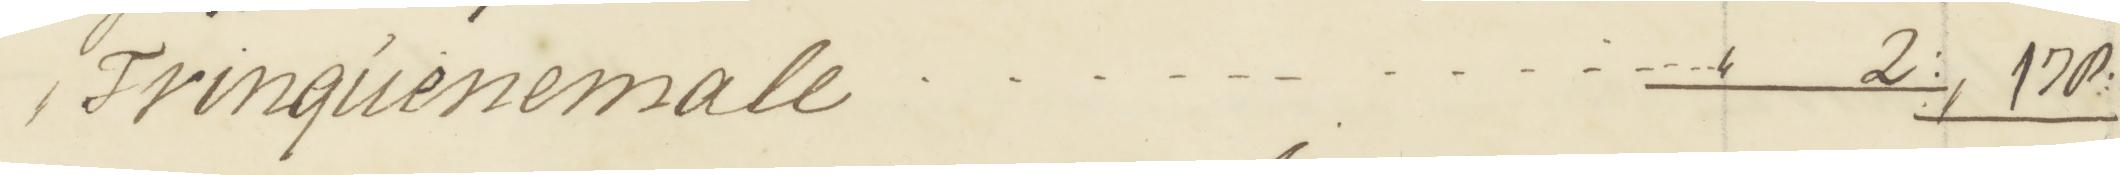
„ Trinquenemale . - - - - - - - - - - - --„ 2: „ 178:
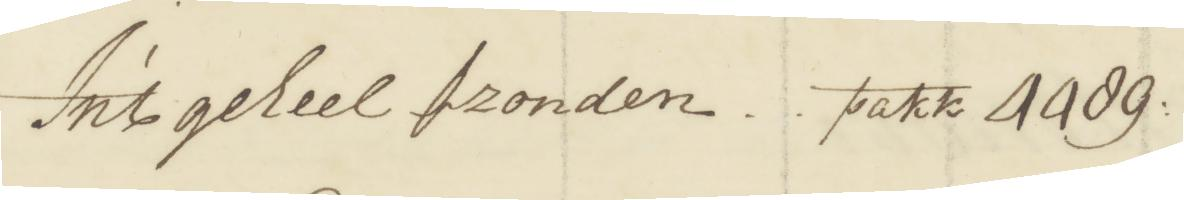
In't geheel verzonden . . pakk 4489:
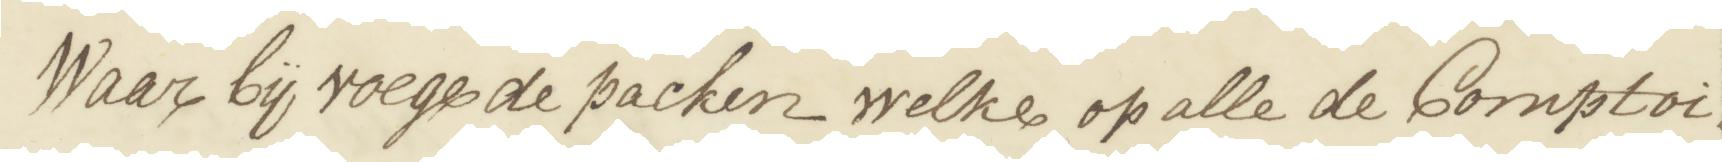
Waar bij voege de packen welke op alle de Comptoi
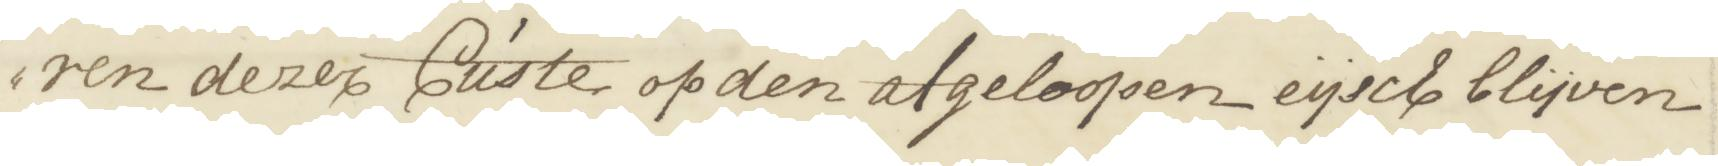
„ren dezer Custe op den afgeloopen eijsch blijven
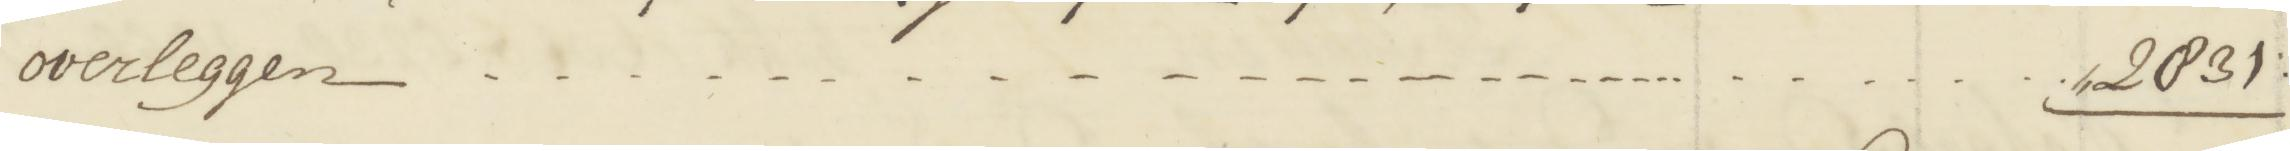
overleggen - - - - - - - - - - - - - - - - - - - -. . - . . . . .„ 2831
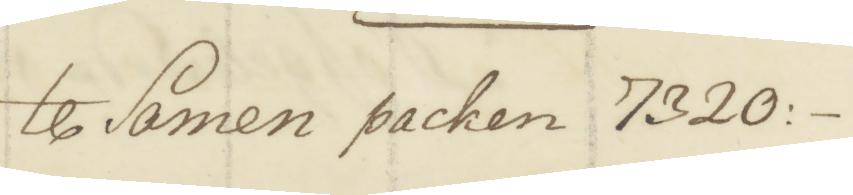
te samen packen 7320: —
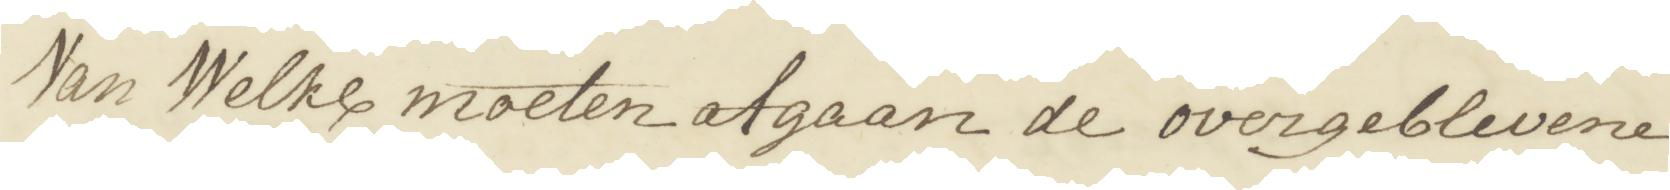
Van Welke moeten afgaan de overgeblevene
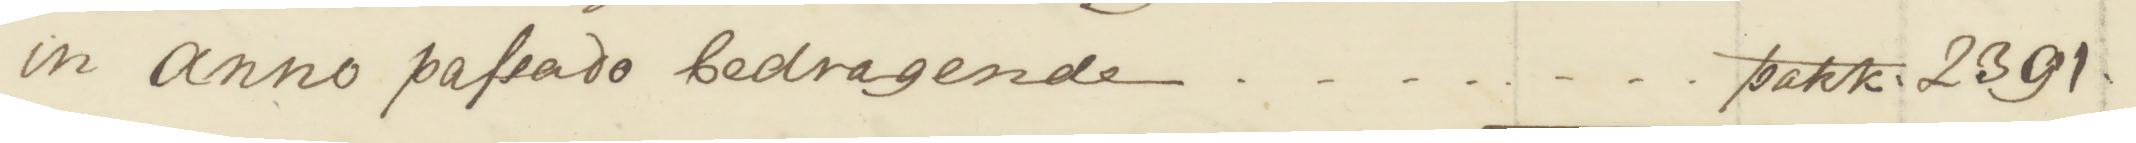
in anno passado bedragende . - - - . - - . pakk, 2391,
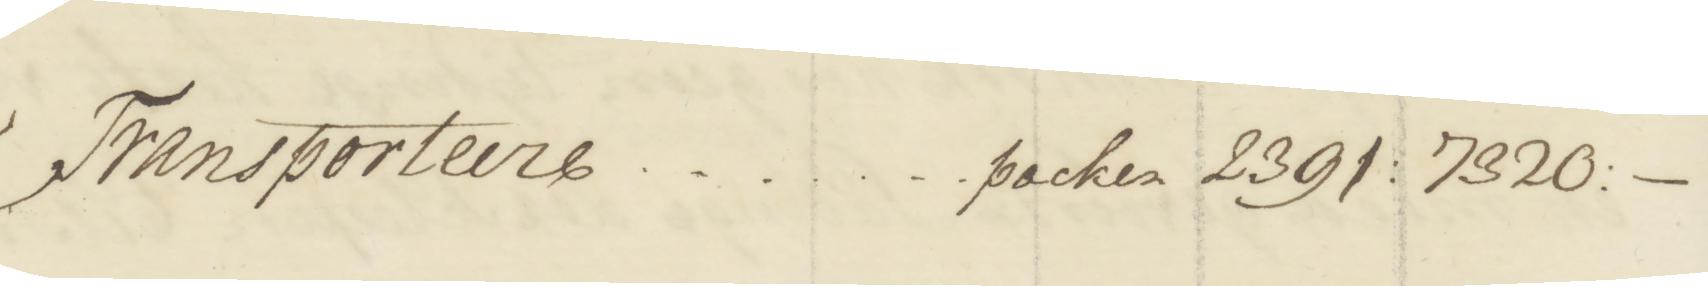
Transporteere . - . . . - . packen 2391: 7320: —
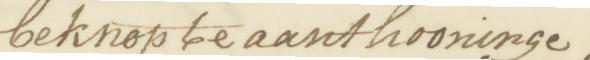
beknopte aanthooninge
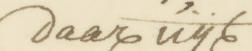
daar uijt
